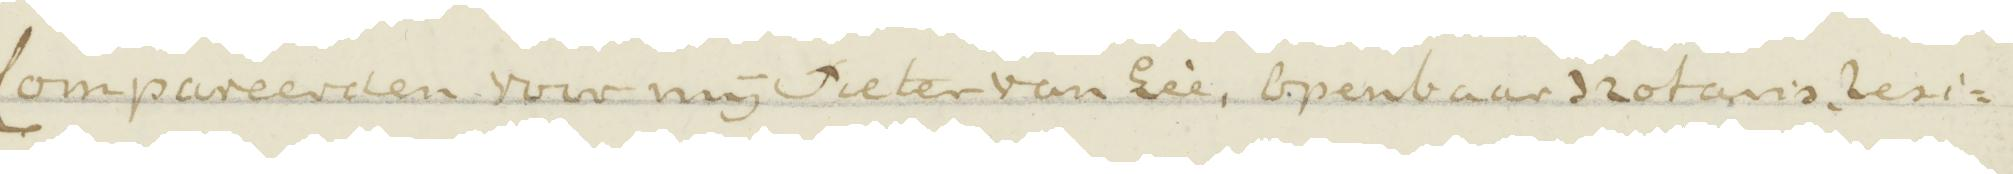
Compareerden voor mij Pieter van Lee, Openbaar Notaris, resi=
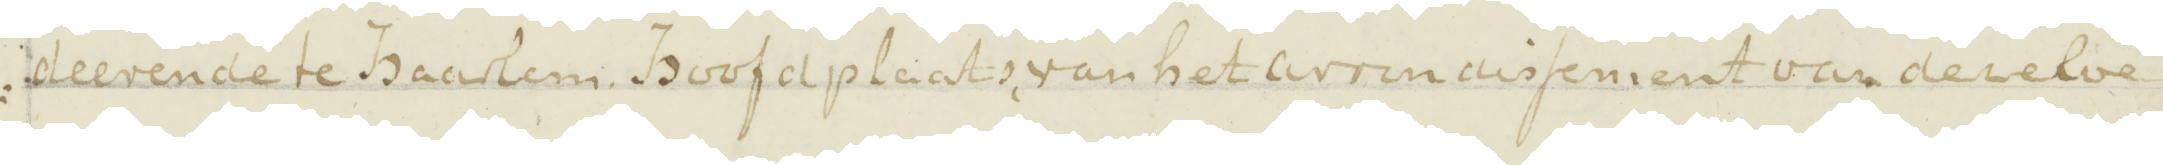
deerende te Haarlem Hoofdplaats van het arrondissement van dezelve
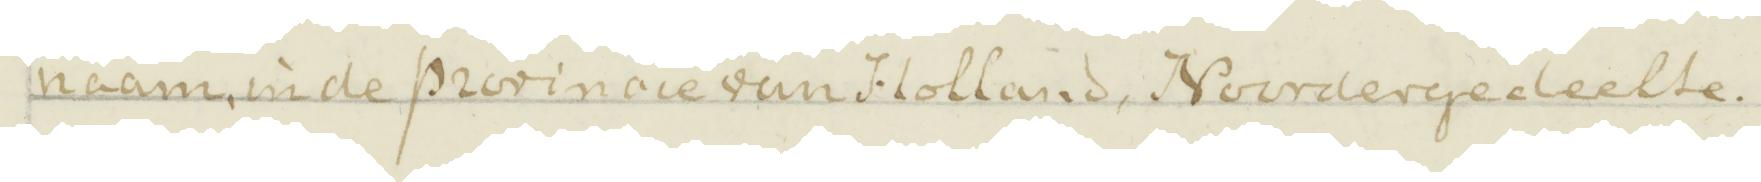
naam in de provincie van Holland Noordergedeelte.
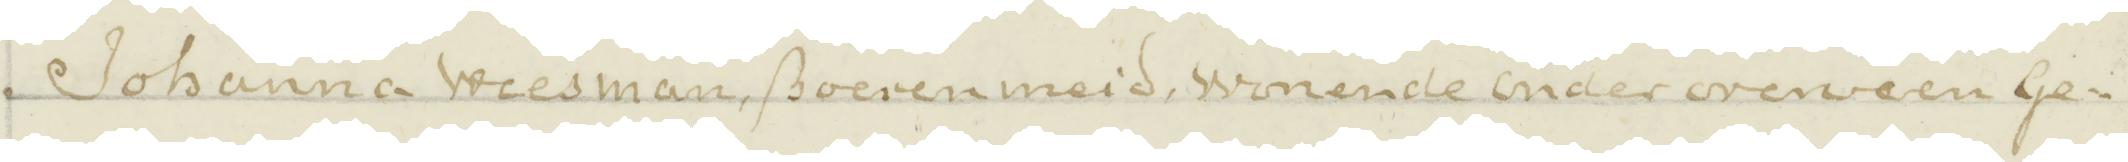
Johanna Weesman, Boerenmeid, wonende onder overveen Ge=
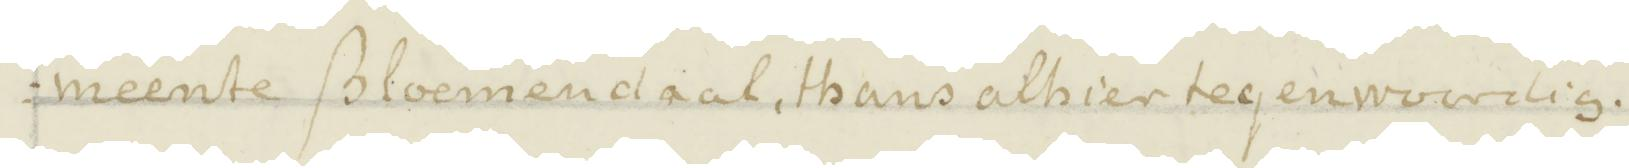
=meente Bloemendaal, thans alhier tegenwoordig.
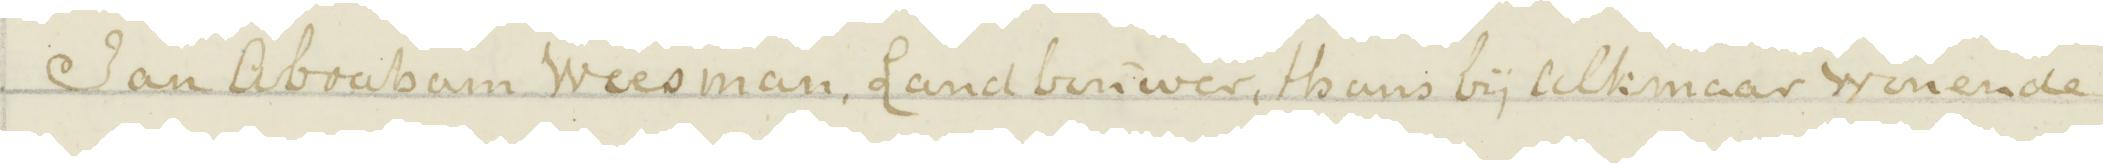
Ian Abraham Weesman, Landbouwer, thans bij alkmaar wonende
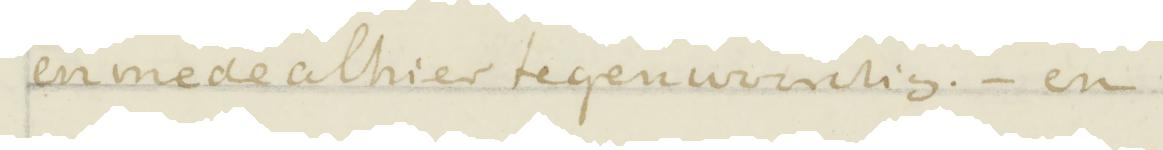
en mede alhier tegenwoordig. - en
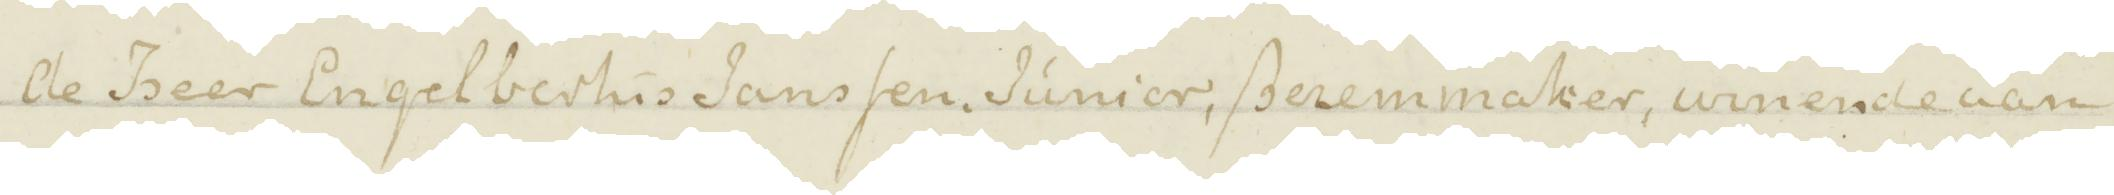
de Heer Engelbertus Ianssen Iunior, Bezemmaker, wonende aan
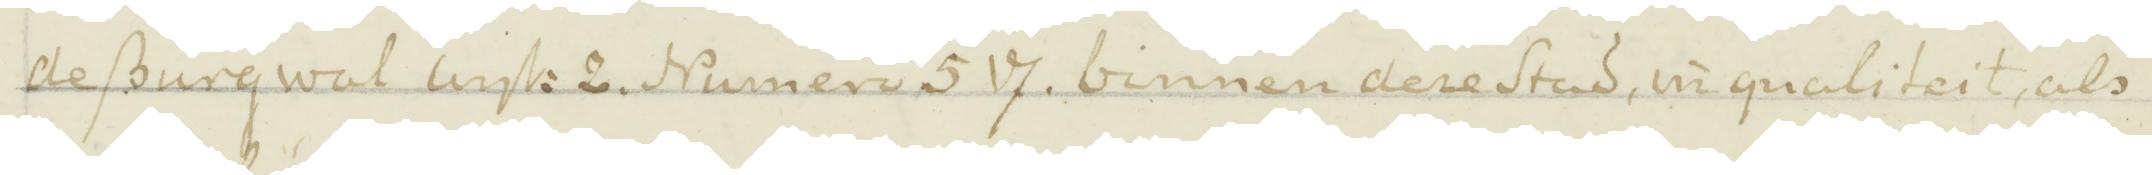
de Burgwal wijk 2. Numero 517. binnen deze stad, in qualiteit als
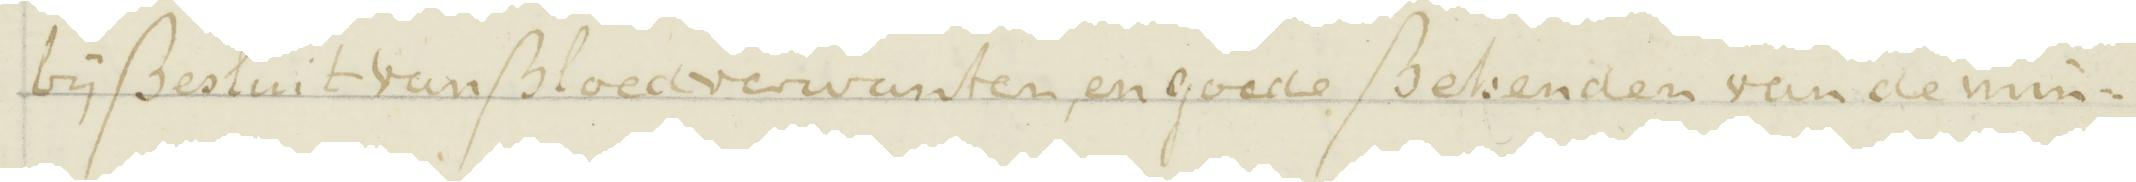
bij Besluit van Bloedverwanten, en goede Bekenden van de min=
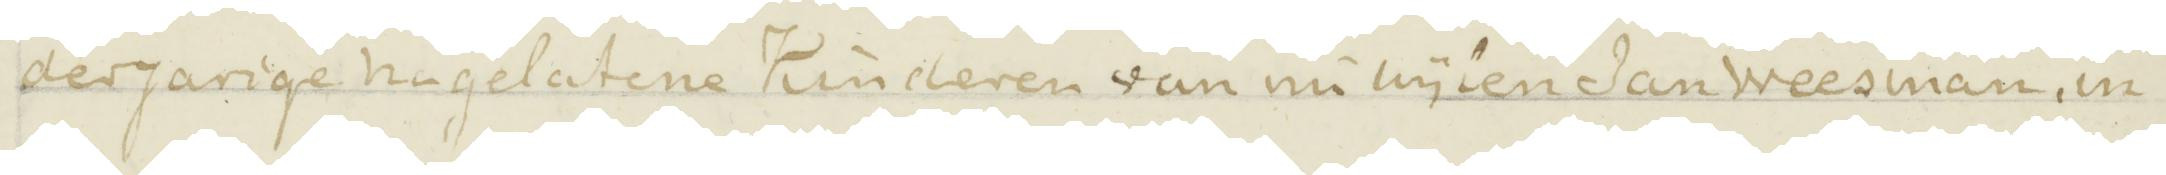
derjarige nagelatene Kinderen van nu wijlen Ian Weesman, in
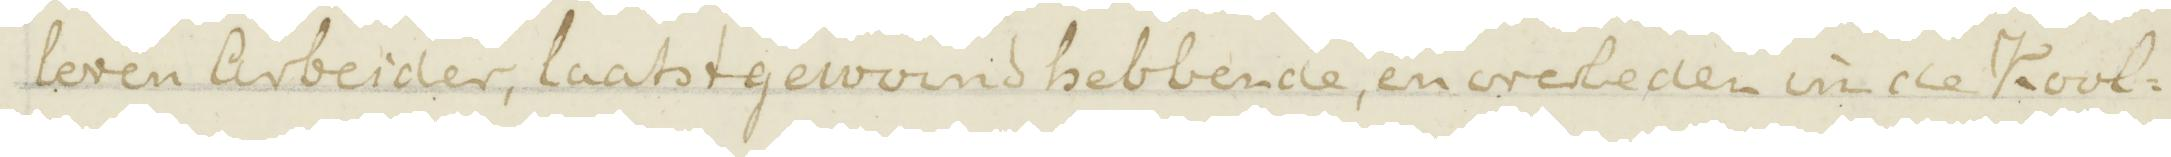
leven Arbeider, laatstgewoond hebbende, en overleden in de Kool=
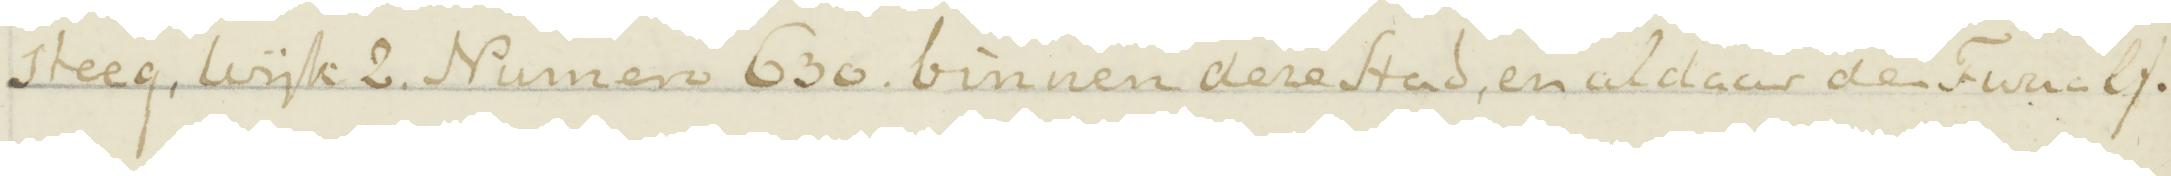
steeg, wijk 2. Numero 630. binnen deze stad, en aldaar den Twaalf.
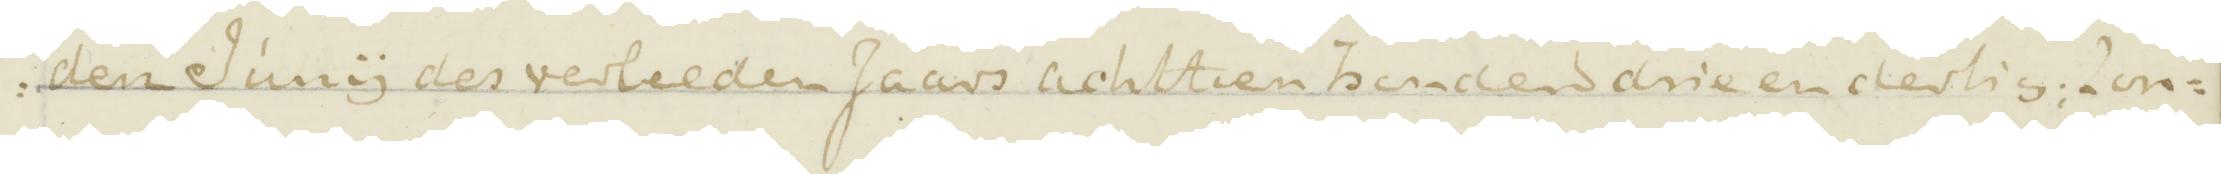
=den Iunij des verleeden Jaars achttien honderd drie en dertig; Zon=
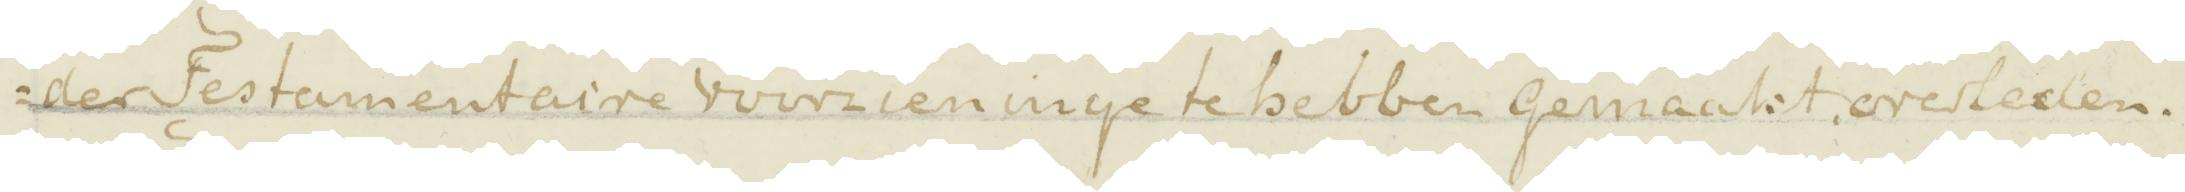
=der Testamentaire voorzieninge te hebben gemaakt, overleden.
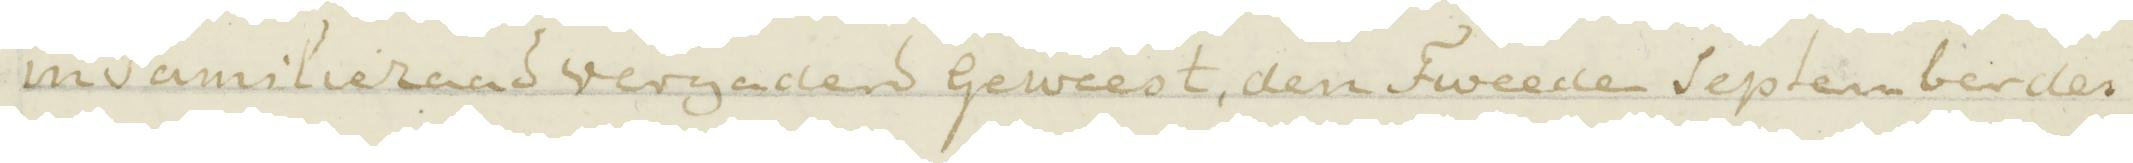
in Familieraad vergaderd geweest, den Tweede September des
